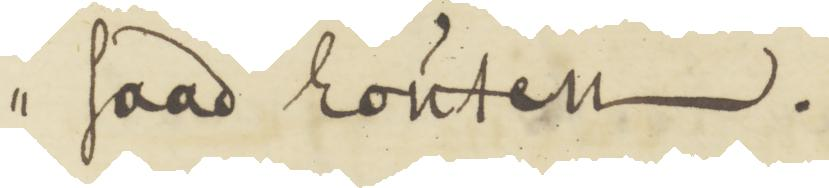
„ saad houten.
